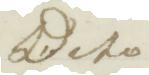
Dito . . . . . . . .
